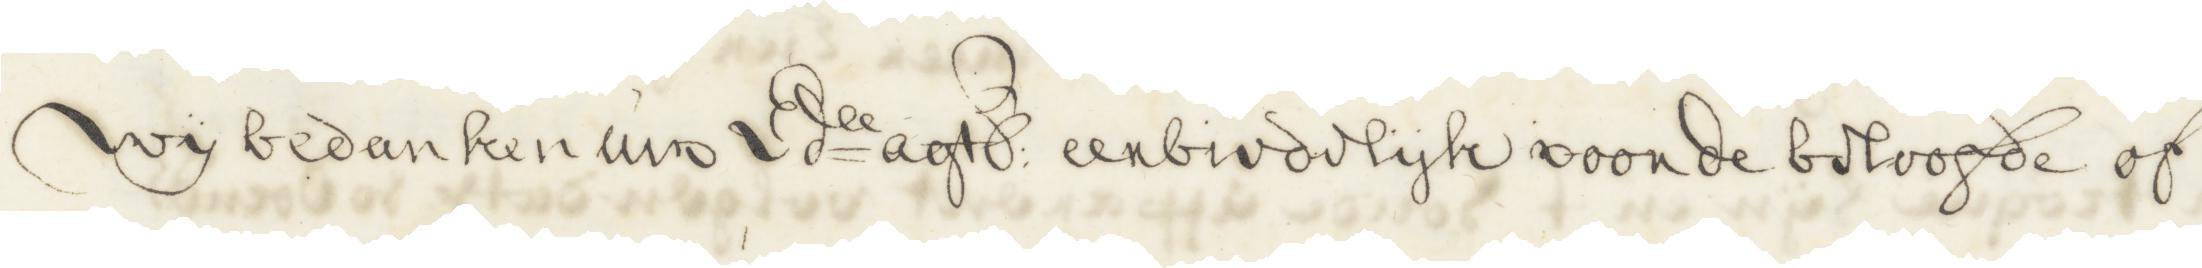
wij bedanken uw Ed=le agtb: eerbiedelijk voor de beloofde of
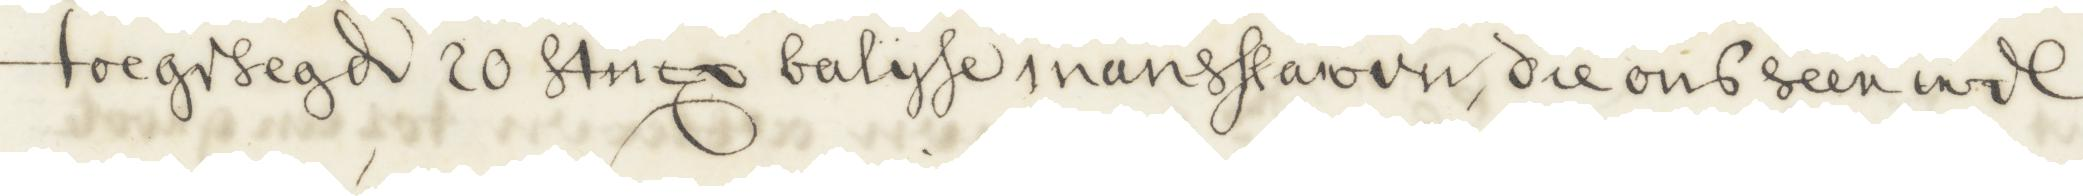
toegesegde 20 stucx balijse mansslaven, die ons seer wel
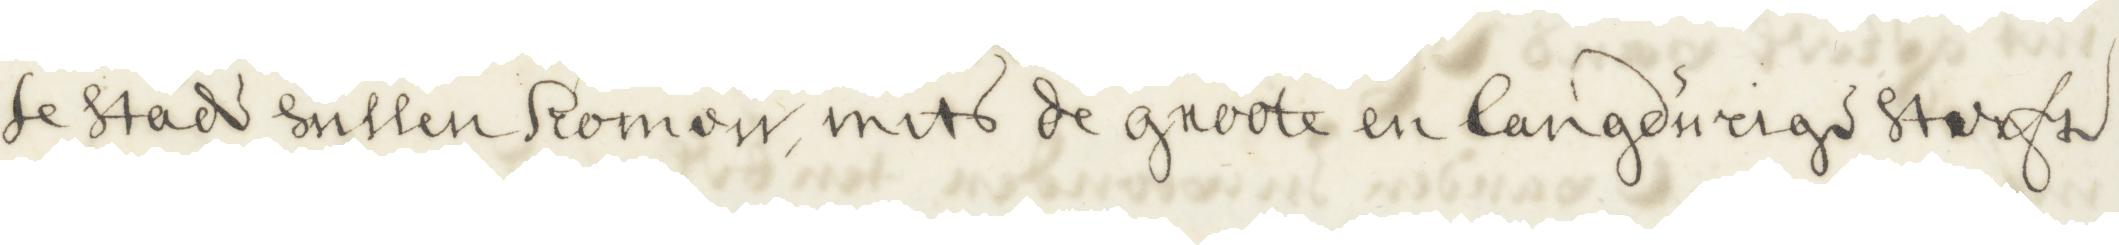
te stade sullen komen, mits de groote en langdurige sterfte
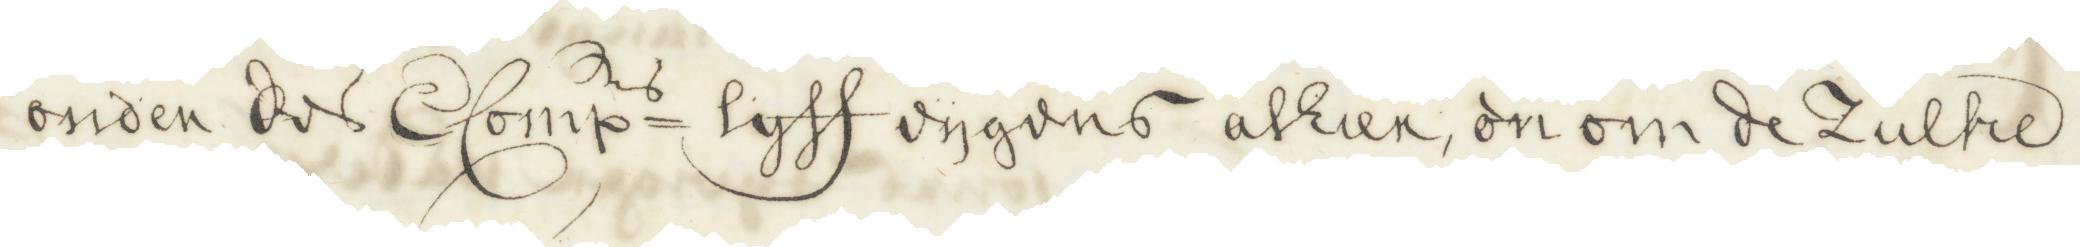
onder des EComp=s lijff eijgens alhier, en om de zulke
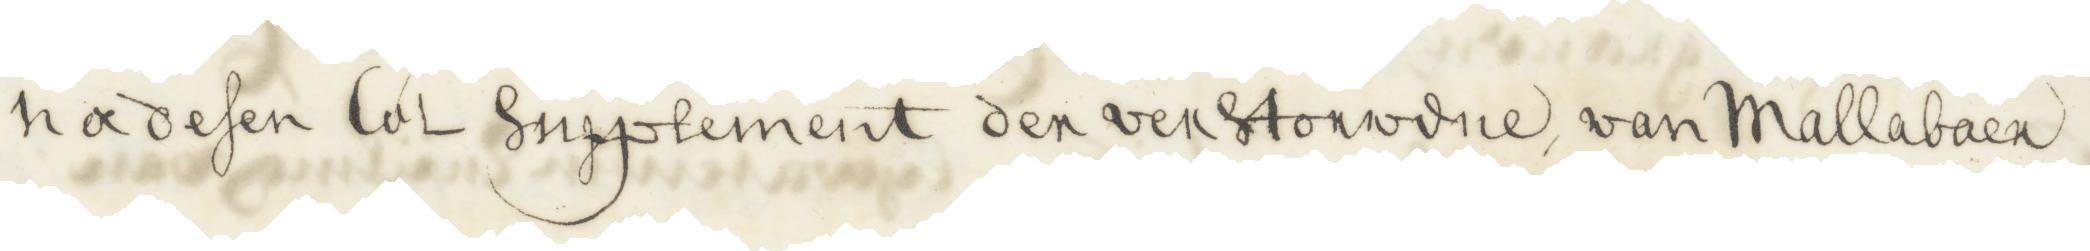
na desen tot supplement der verstorvene, van Mallabaer
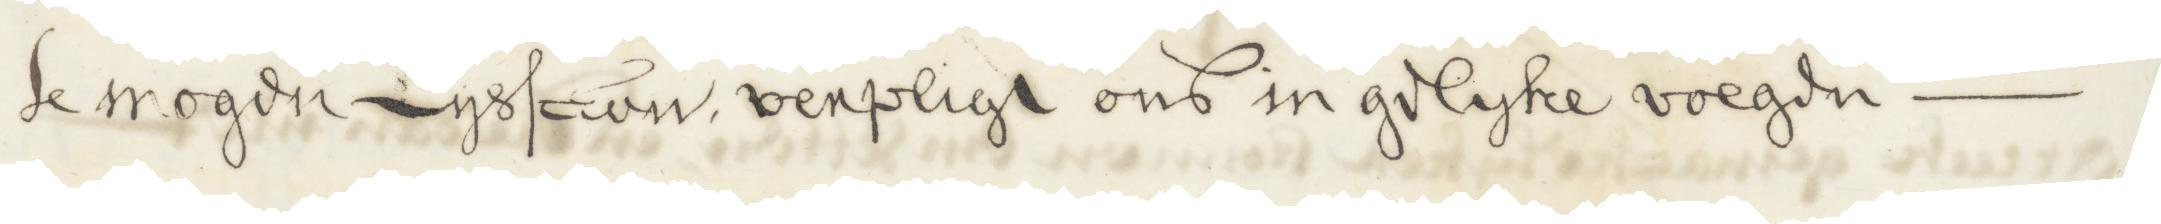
te mogen Eijsschen, verpligt ons in gelijke voegen. —
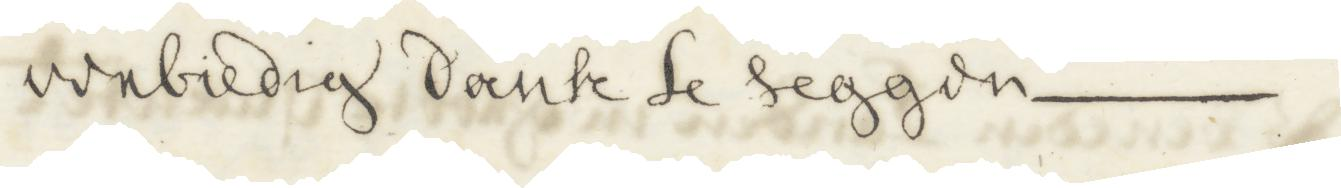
eerbiedig dank te seggen —
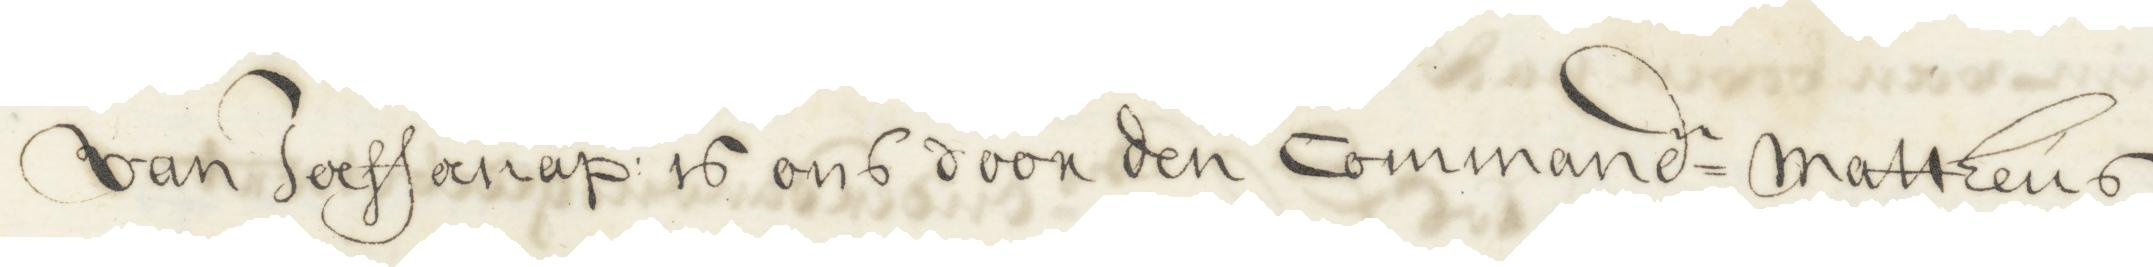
van Jaffanap: is ons door den command=r mattheus
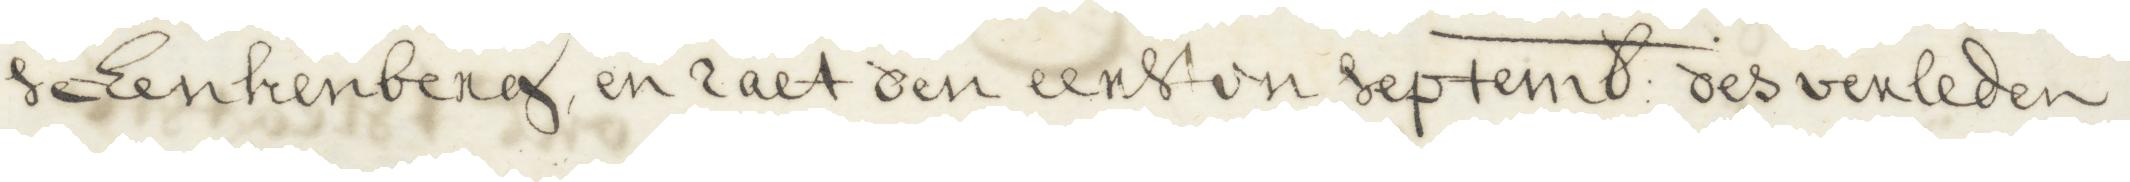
schenkenberg, en raet den eersten septemb: des verleden
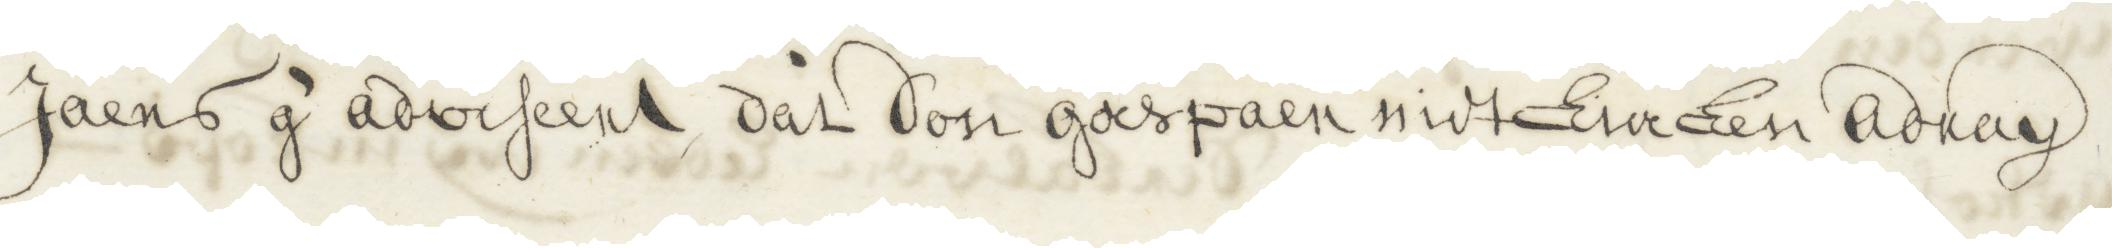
Jaers g’adviseert, dat don goespaer nietchiacken adraij
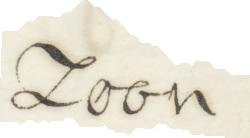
Zoon
